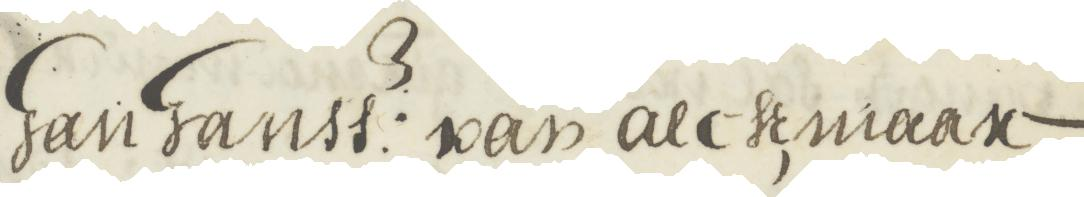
Jan Janss:z van alckmaar
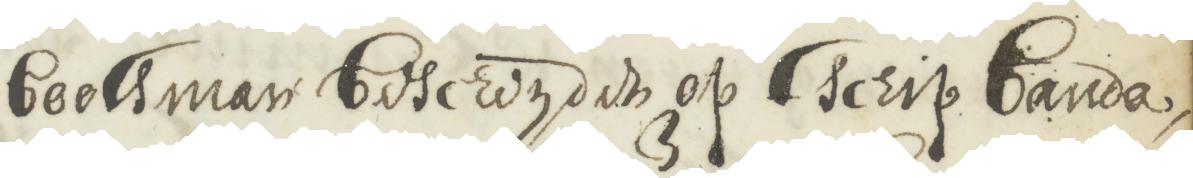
bootsman bescheijden op ’t schip banda,
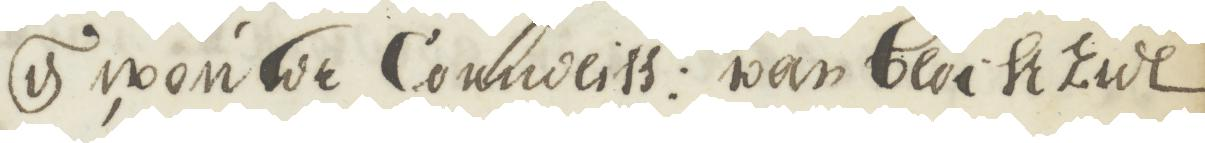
ende wouter Corneliss:z van blockziel
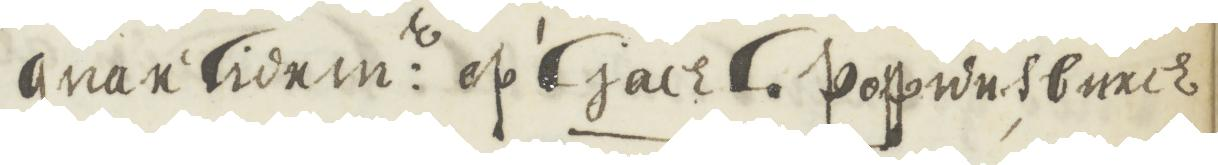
quartierm:r op ’t jacht poppiensburch
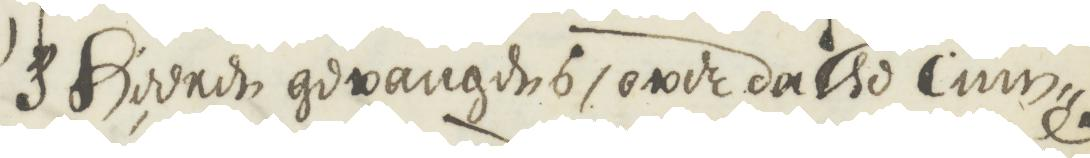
's Heeren gevangens, over datse cum„
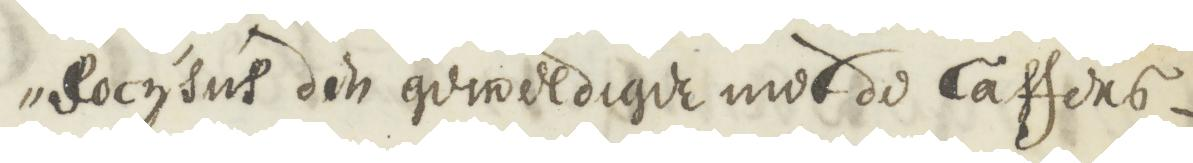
„socijens den geweldiger met de Caffers
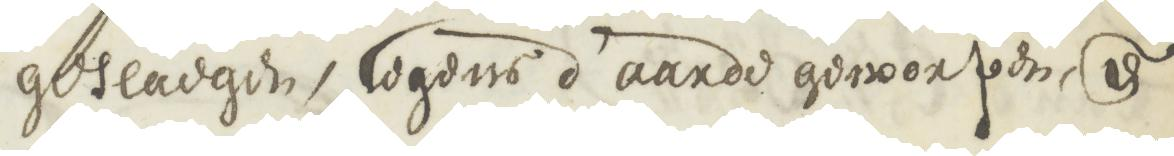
geslaegen, tegens d’ aarde geworpen, ende
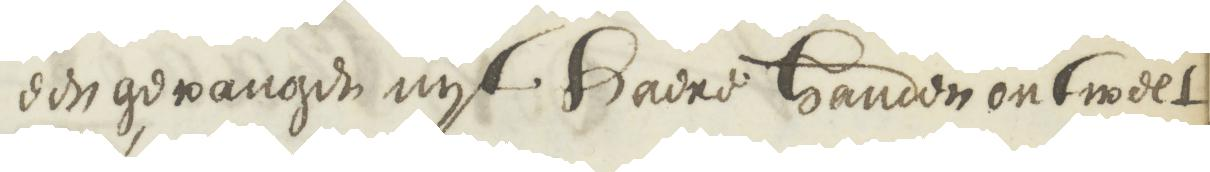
een gevangen uijt haere handen ontwelt
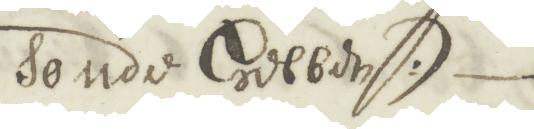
soude hebben:) —
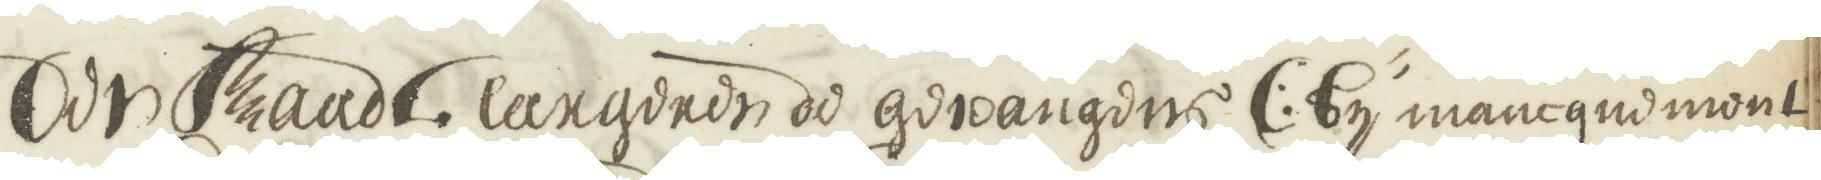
den Raadt largeren de gevangens (:bij mancquement
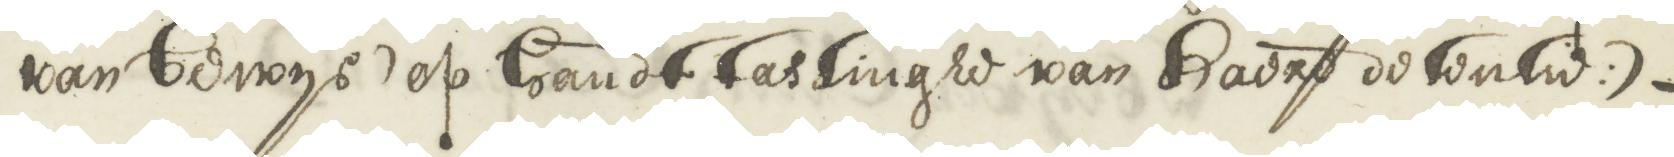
van bewijs op handttastinghe van haere detentie:)
